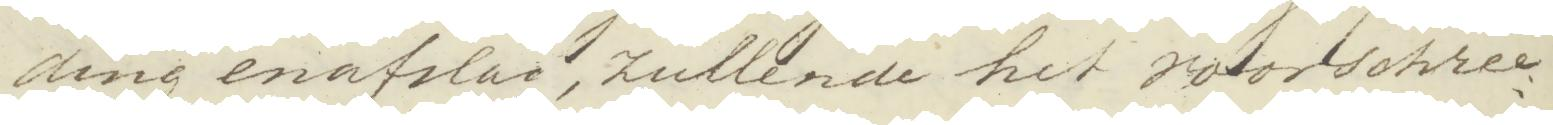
=ding en afslag, zullende het voorschree:
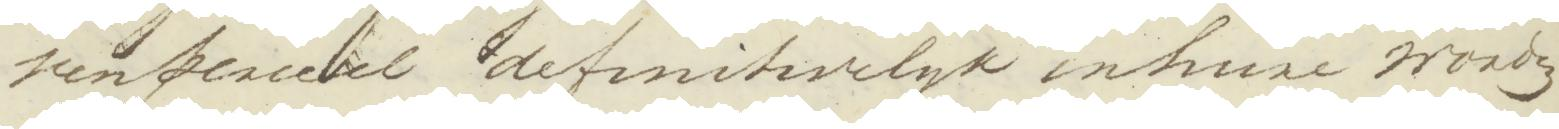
ven perceel definitivelyk in hure worden
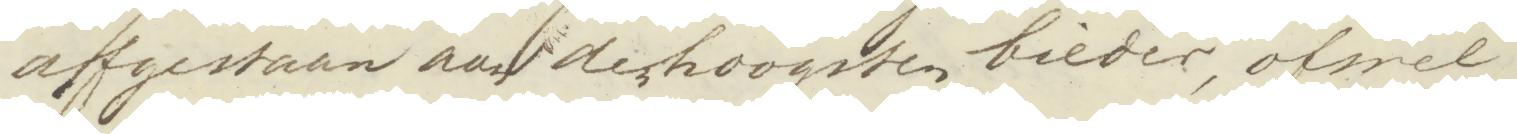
afgestaan aan de hoogsten bieder, ofwel
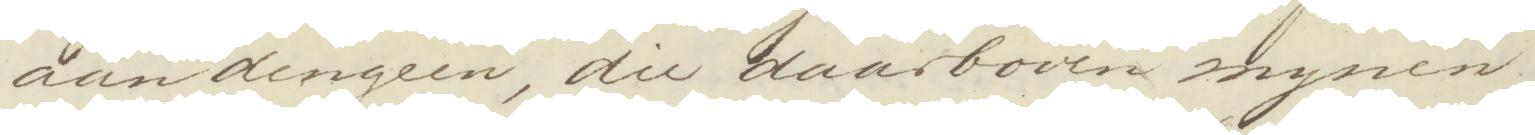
aan dengeen, die daarboven mynen
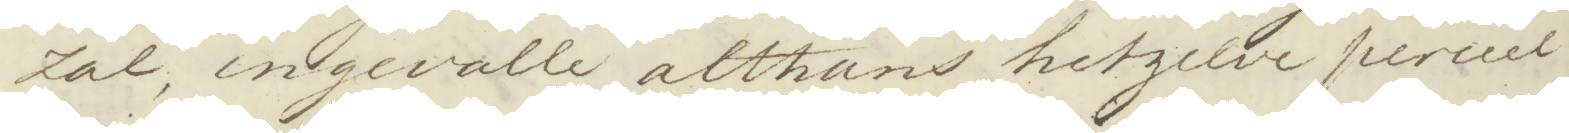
zal, in gevalle althans hetzelve perceel
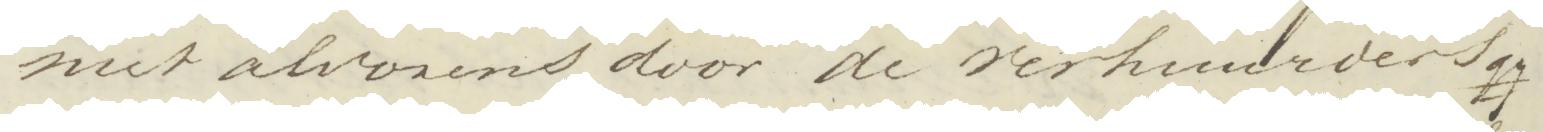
niet alvorens door de verhuurders qq
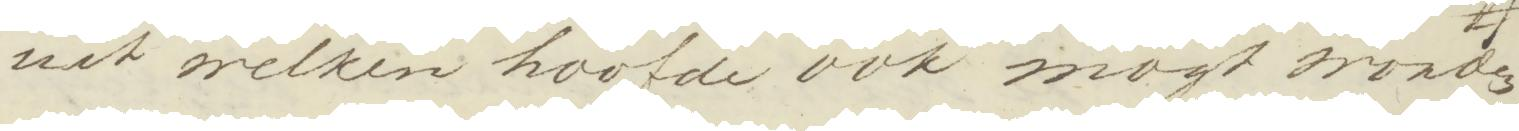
uit welken hoofde ook mogt worden
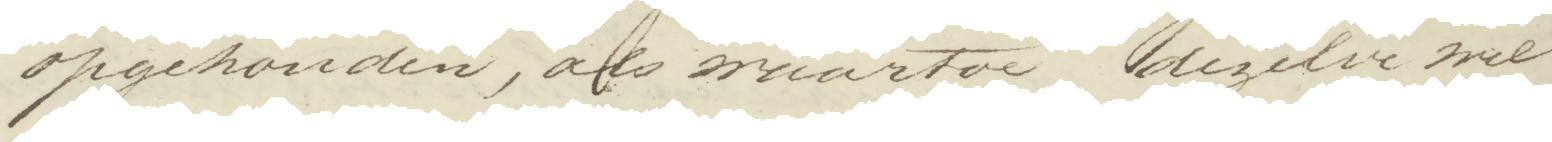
opgehouden, als waartoe dezelve wel
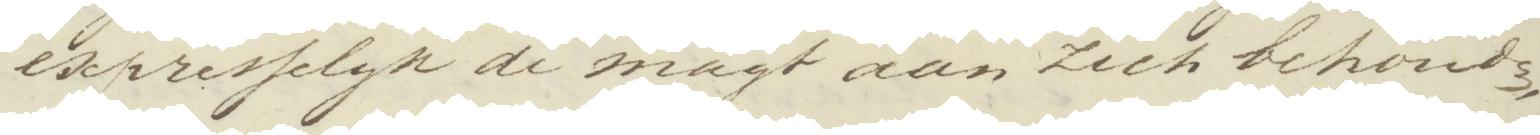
expresselyk de magt aan zich behouden,
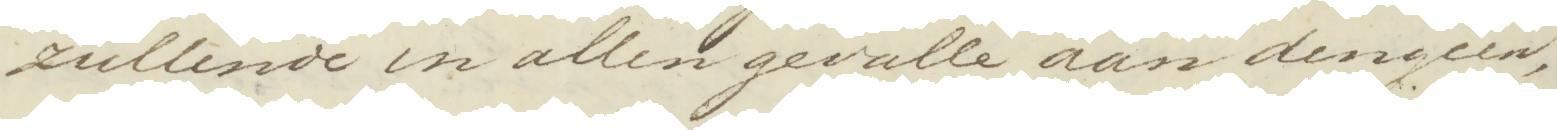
zullende in allen gevalle aan dengeen,
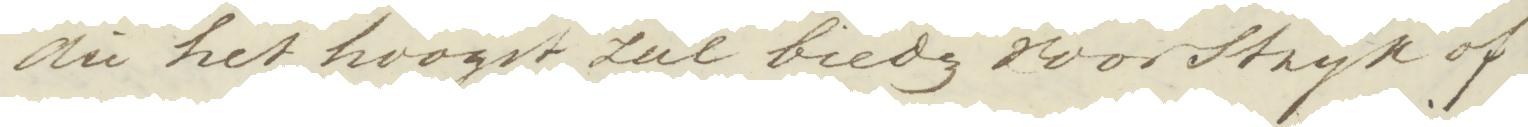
die het hoogst zal bieden voorstryk of
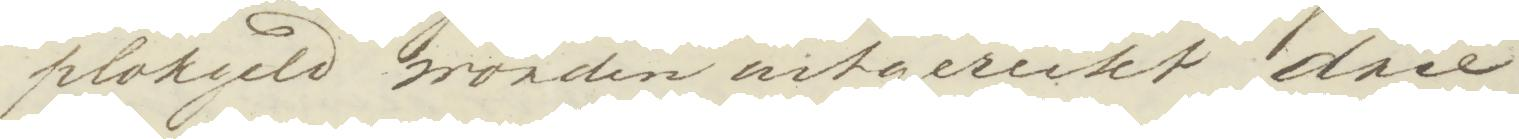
plokgeld worden uitgereikt drie
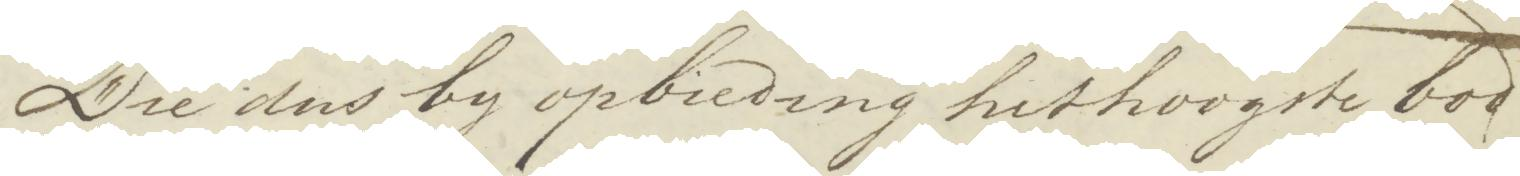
Die dus by opbieding het hoogste bod
